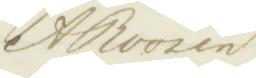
ARoozen
